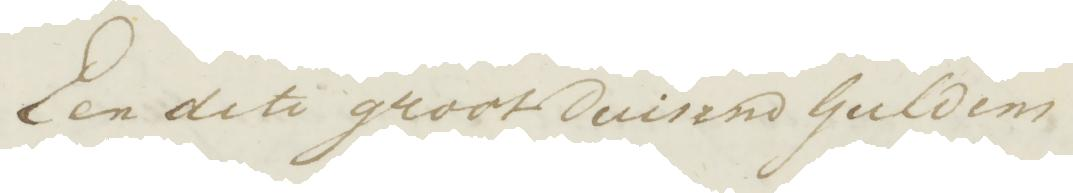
Een dito groot duisend Guldens
